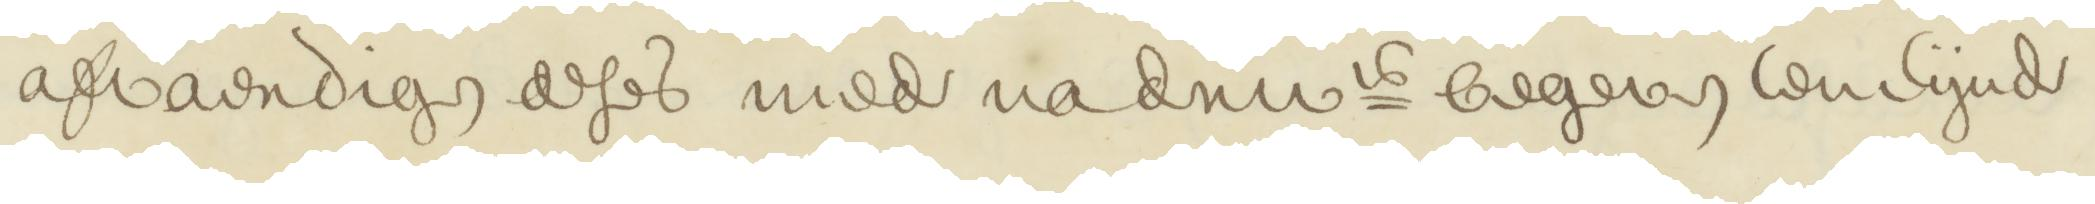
afvaerdigen deses mede nadrw=ts begeven ten Eijnde
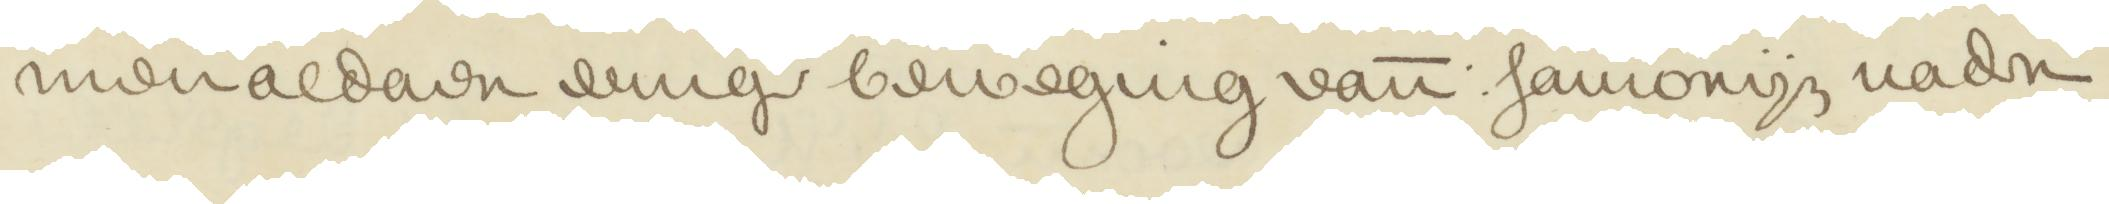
men aldaer eenige beweging van: samorijn nadr
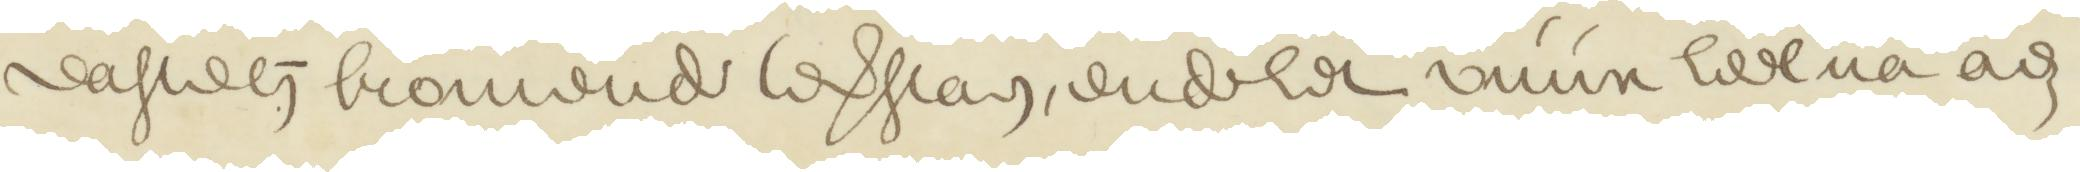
vastelijk komende te verstaen, ende het vuur heel na aen
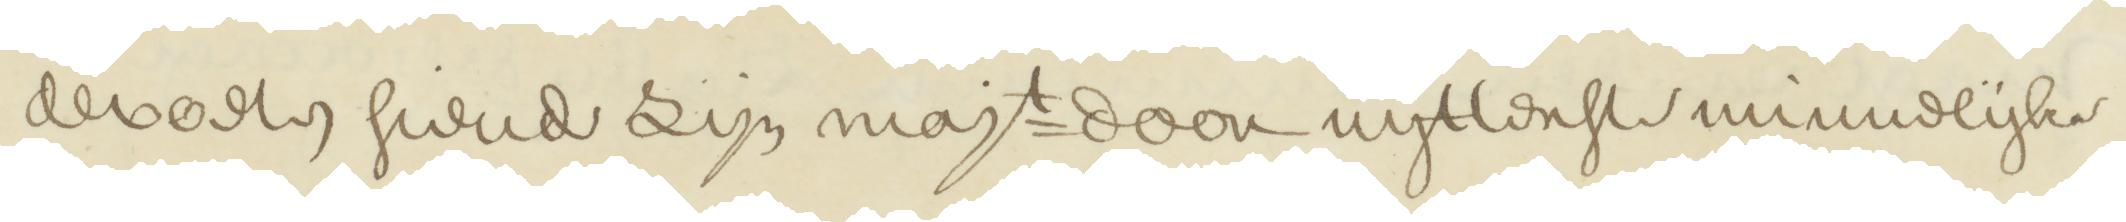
devoeten siende zijn maj=t door uijtterste minnelijke
